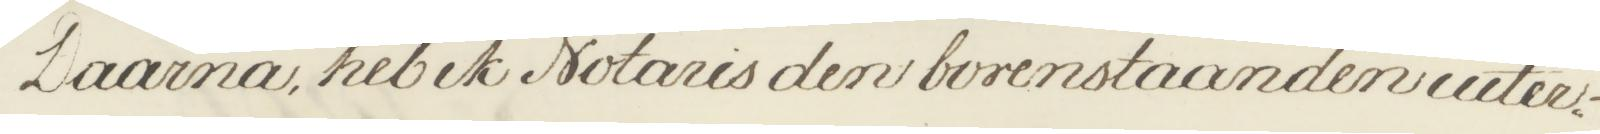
Daarna, heb ik Notaris den bovenstaanden uiter„
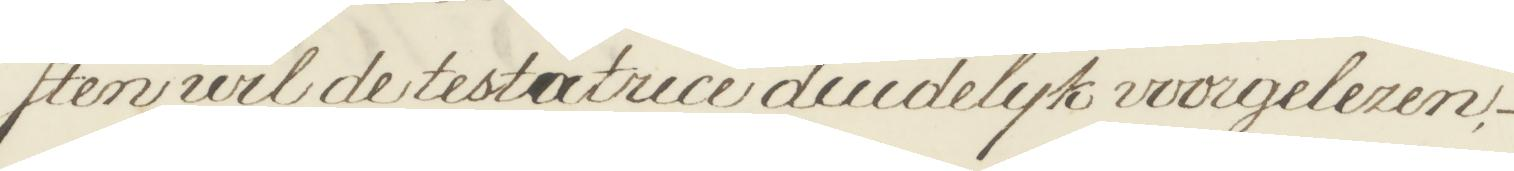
sten wil de testatrice duidelyk voorgelezen,
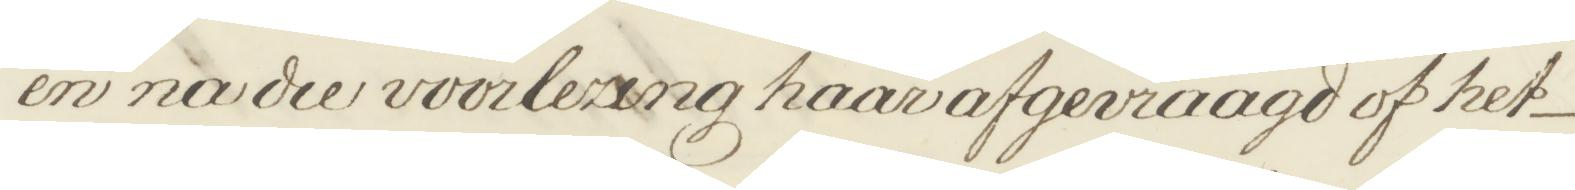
en na die voorlezing haar afgevraagd of het
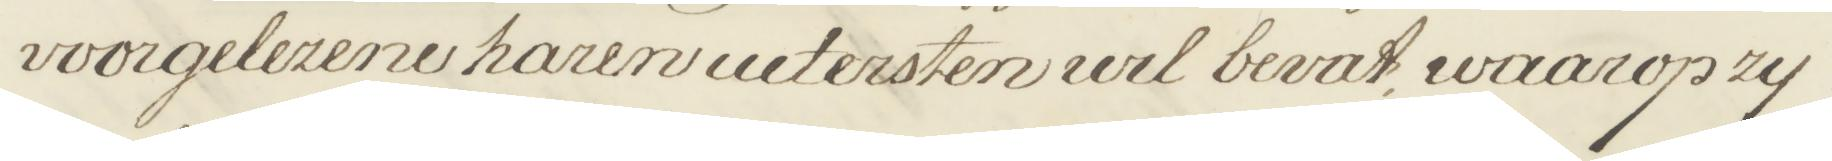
voorgelezene haren uitersten wil bevat, waarop zy
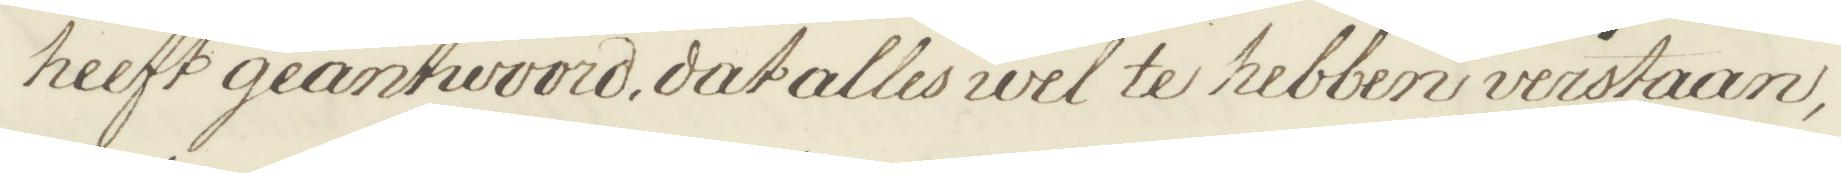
heeft geantwoord, dat alles wel te hebben verstaan,
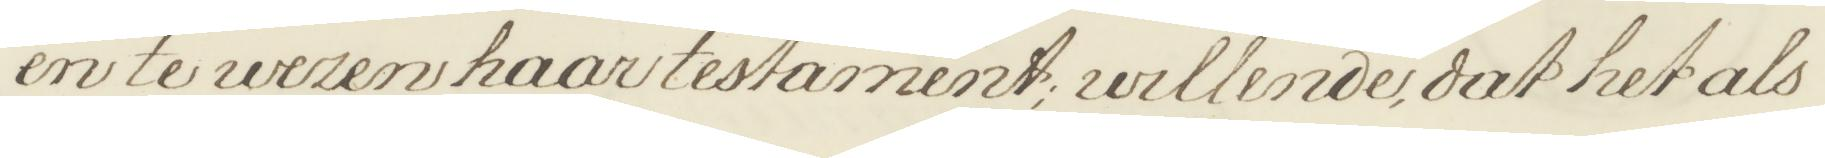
en te wezen haar testament; willende, dat het als
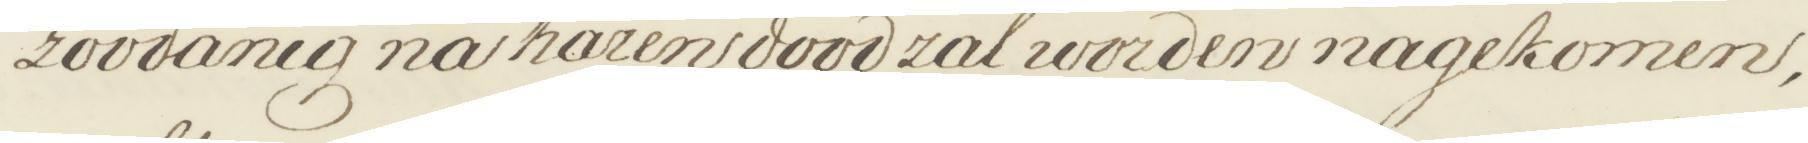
zoodanig na haren dood zal worden nagekomen,
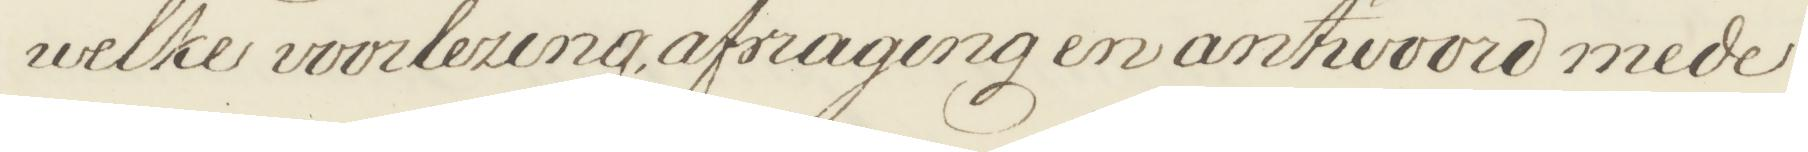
welke voorlezing, afvraging en antwoord mede
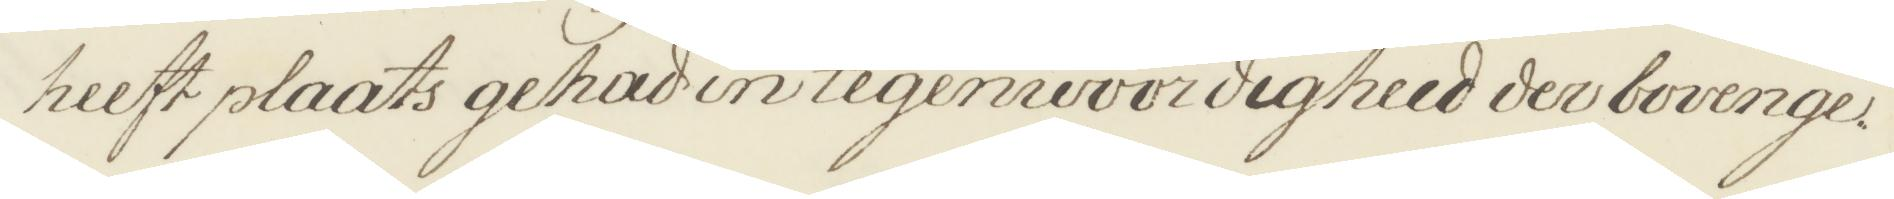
heeft plaats gehad in tegenwoordigheid der bovenge„
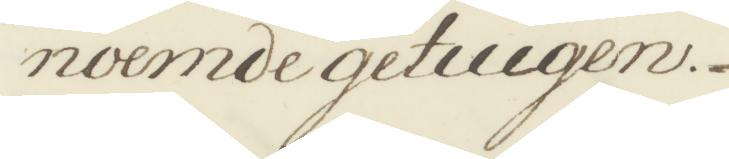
noemde getuigen.
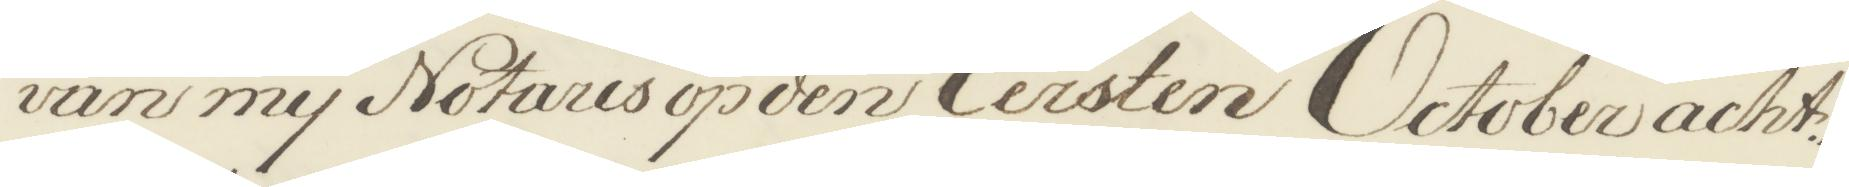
van my Notaris op den Eersten October acht„
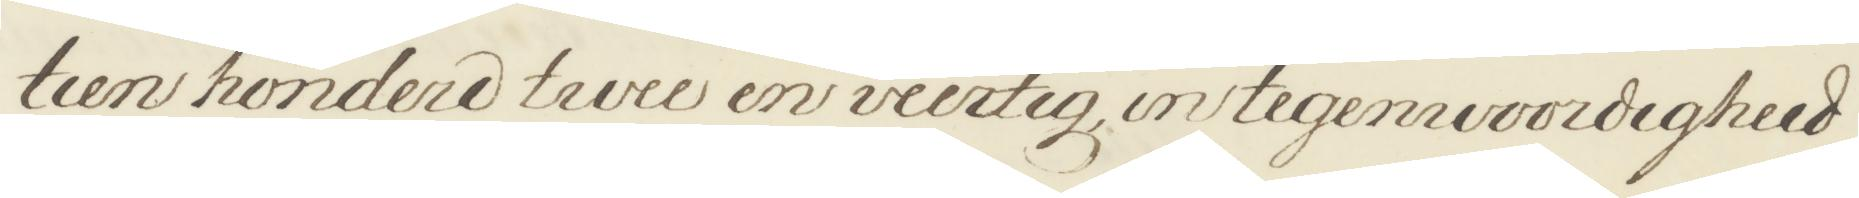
tien honderd twee en veertig, in tegenwoordigheid
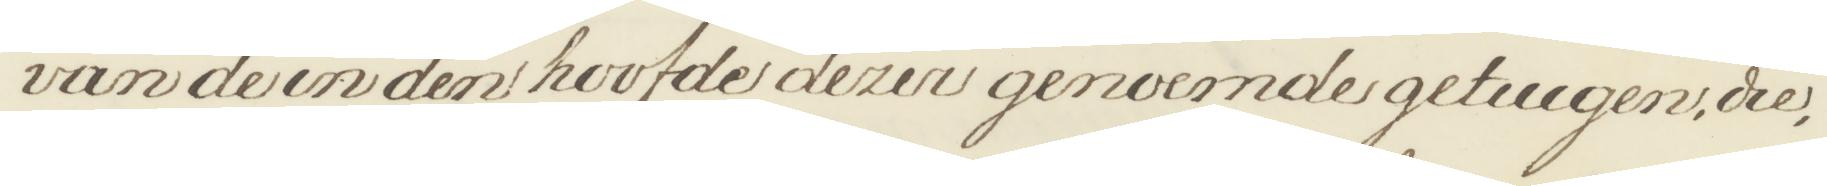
van de in den hoofde dezer genoemde getuigen, die,
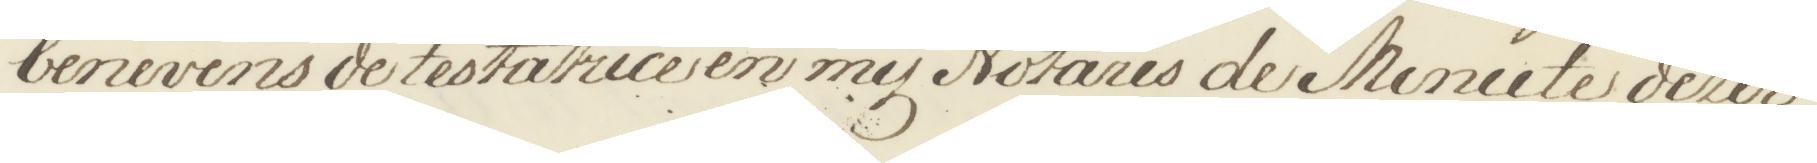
benevens de testatrice en my Notaris de Minute dezer
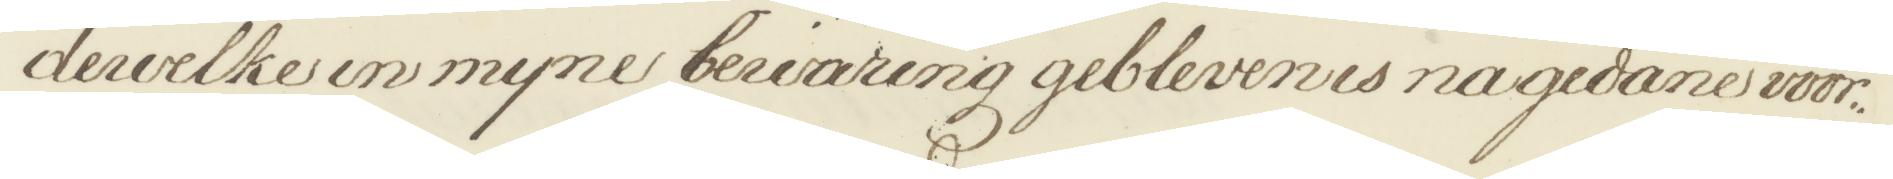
dewelke in myne bewaring gebleven is na gedane voor„
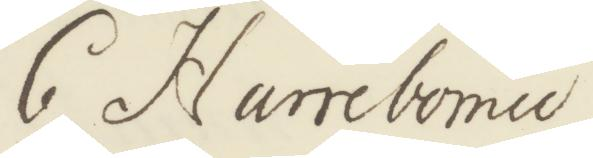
C Harrebomee
